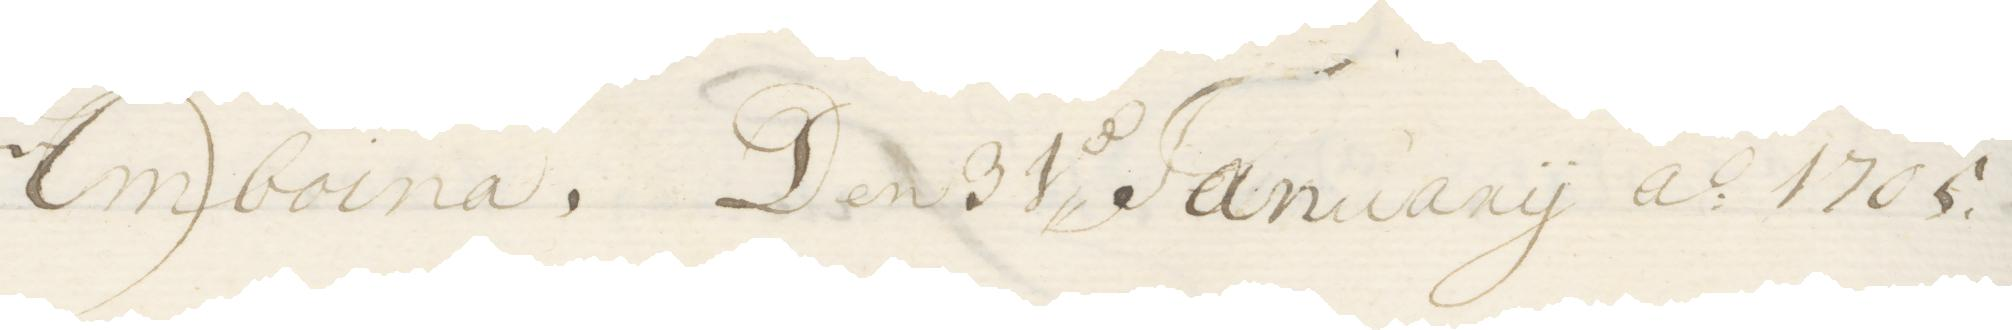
Amboina, den 31„en Ianuarij a:o 1705.
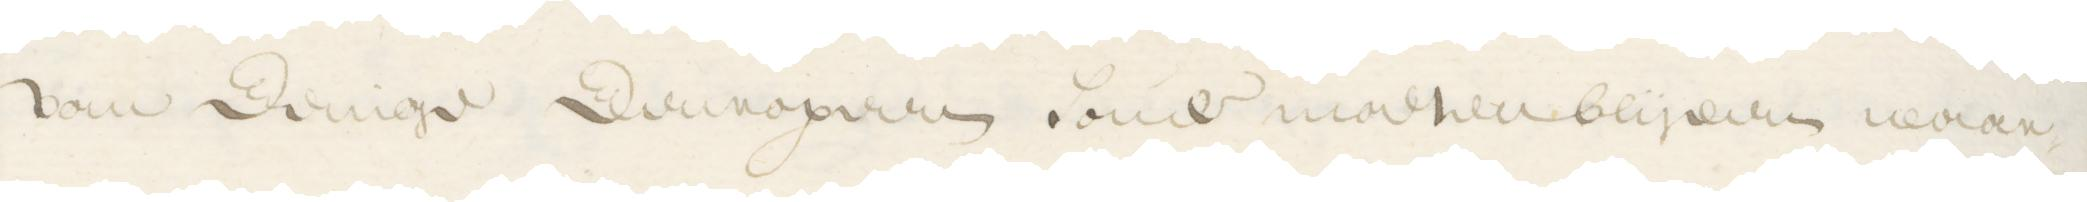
van Eenige Eeuropeen souden moeten blijven waar„
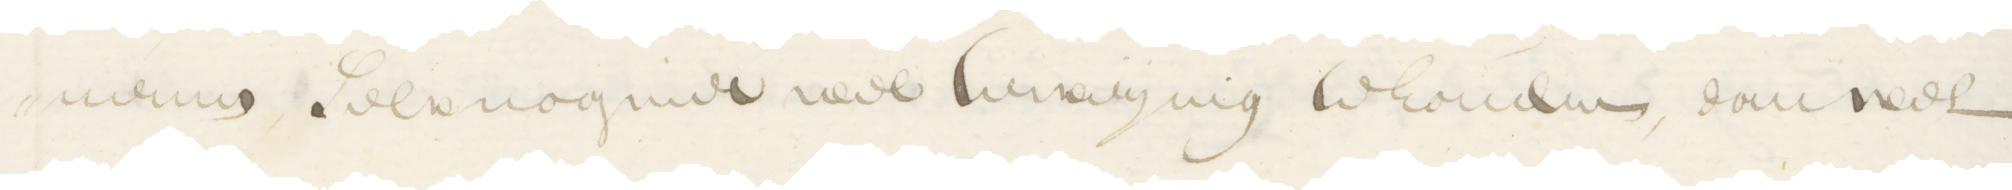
„nemen, selv nog niet wel teweijnig tehouden, dan wel
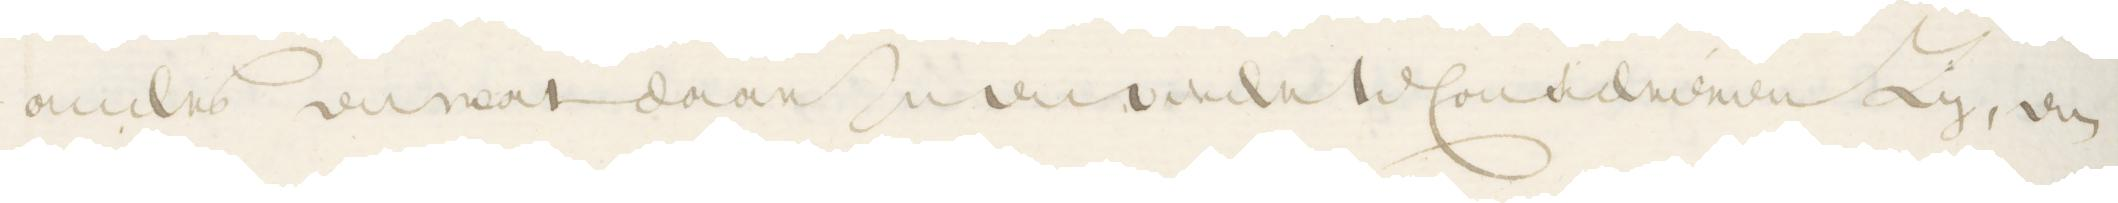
anders enwat daar In en verder te Considereren Zij, en
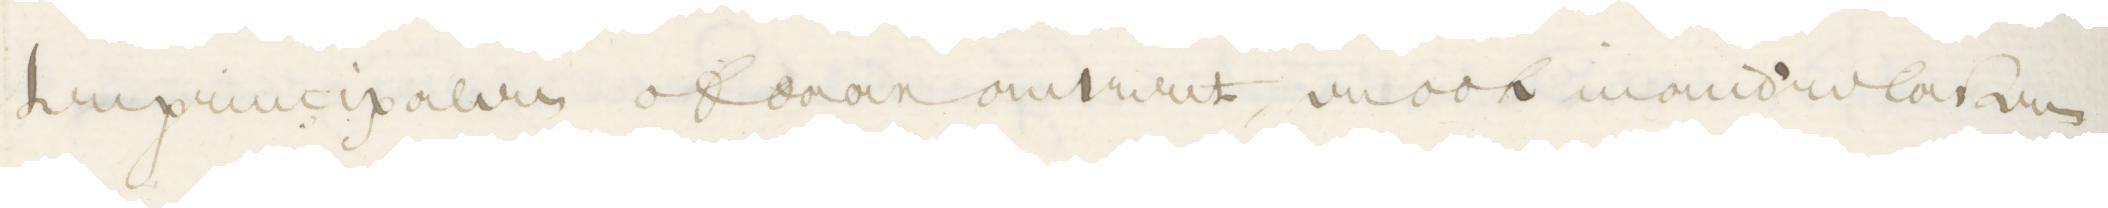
ten principalen of daar omtrent, en ook in and're lasten
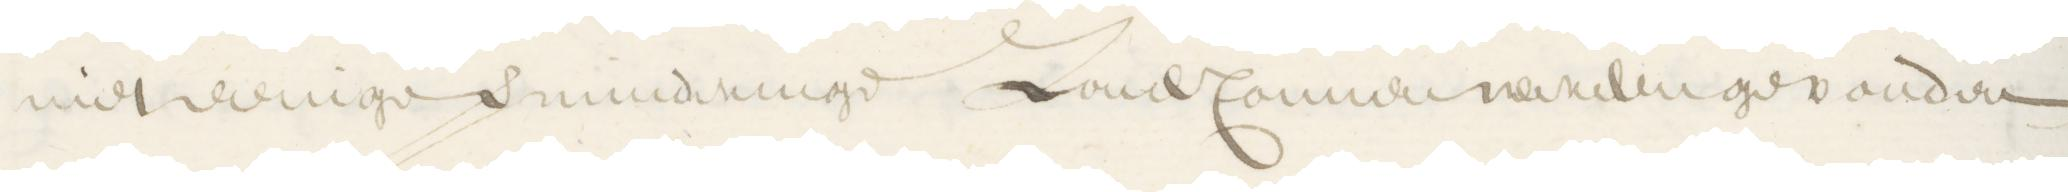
niet eenige verminderinge Zoude Connen werden gevonden
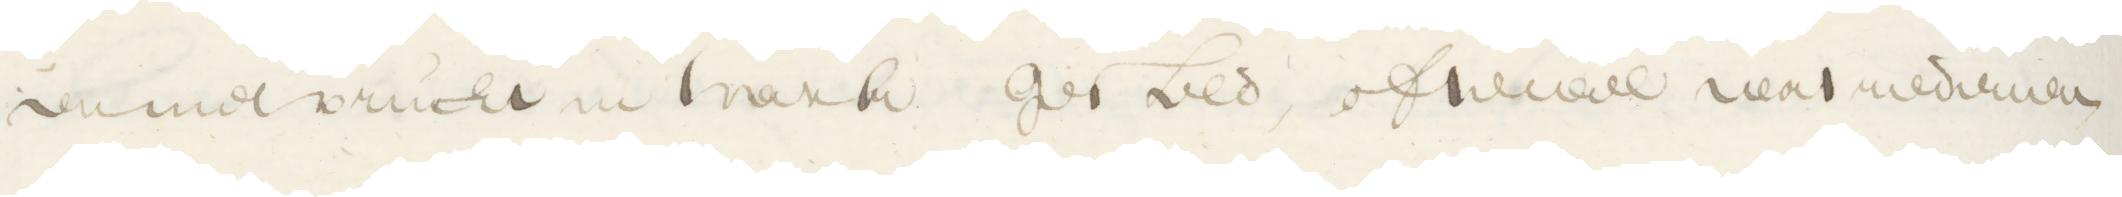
en met vrucht in wark gesteld, oftewel wat redenen
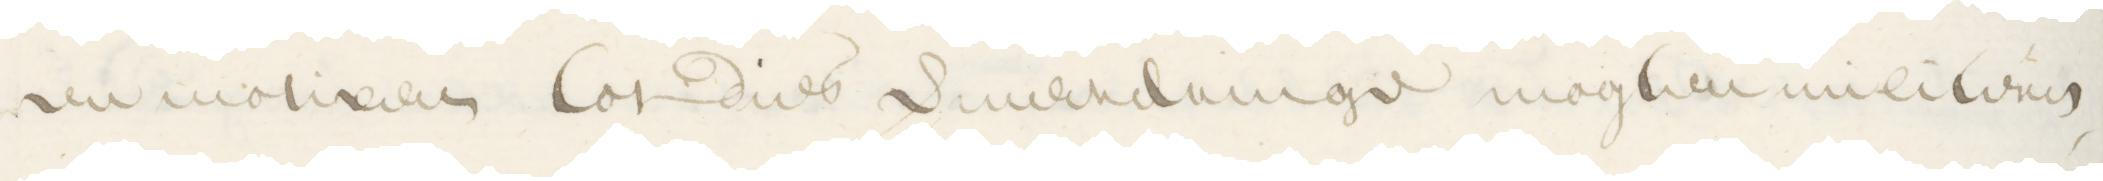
en motiven tot dies vermeerdringe mogten militeren
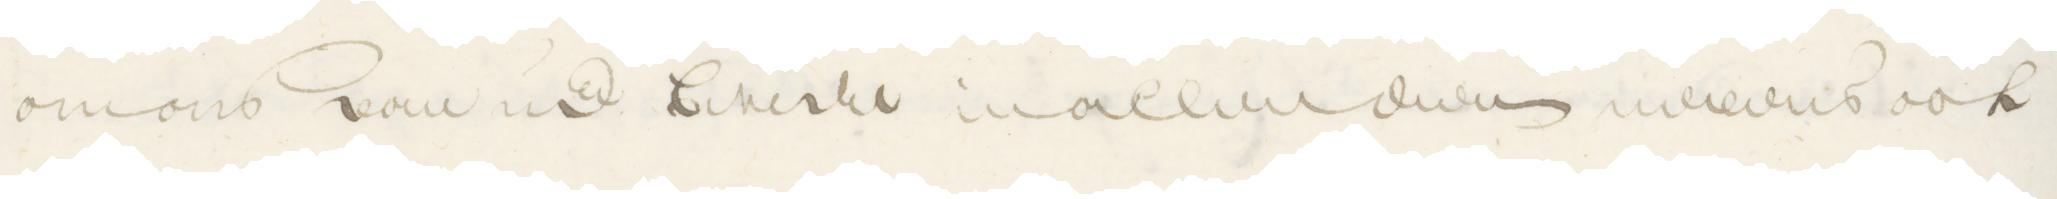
om ons van uE. biricht in allen dien nevens ook
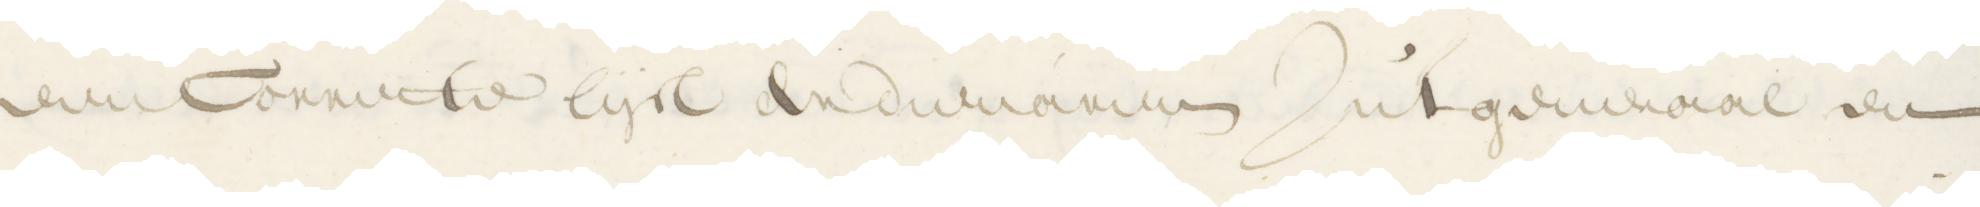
een correcte lijst der dienaren In't generaal en
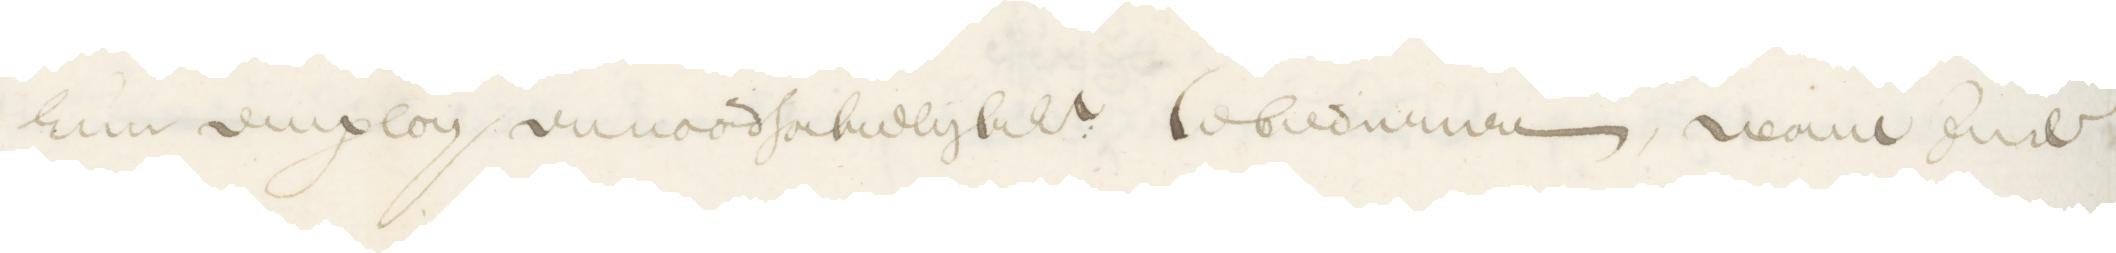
hun employ en noodsakelijkh:t te bedienen, want Inde
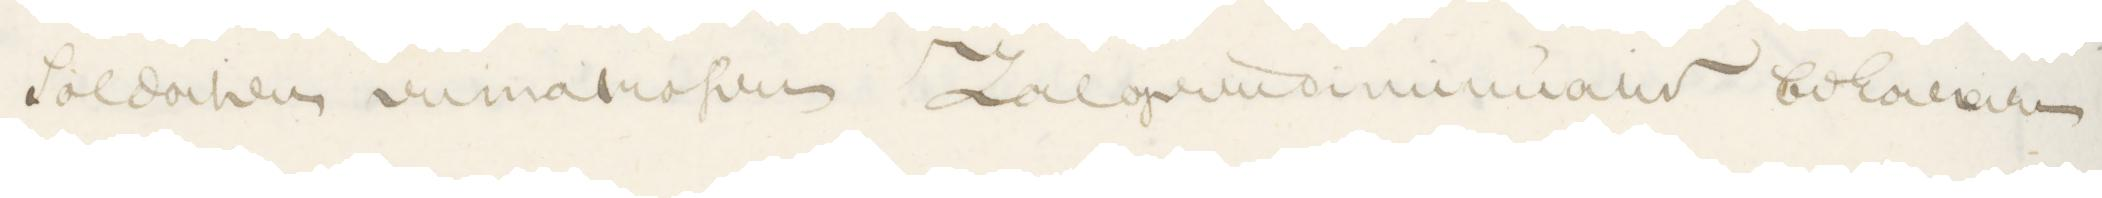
soldaten en matrosen Zal geen diminuaties behalven
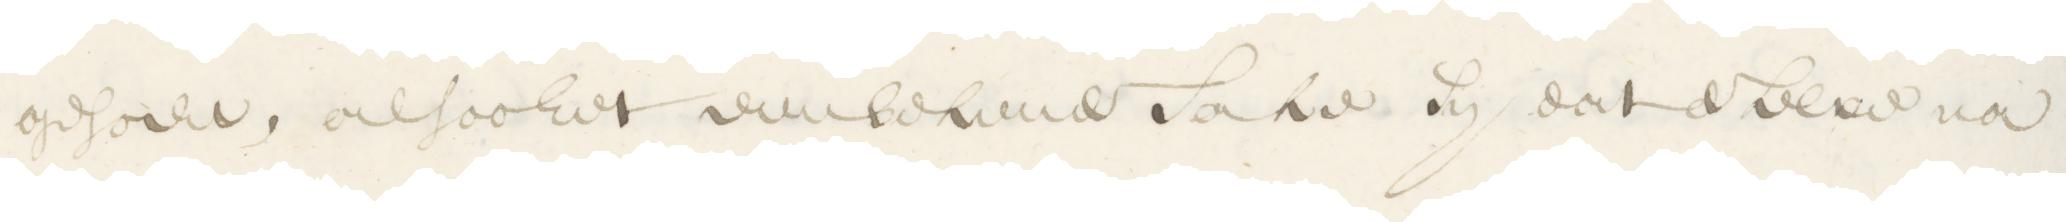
gesoet, alsoo het een bekende sake sij dat dezelve na
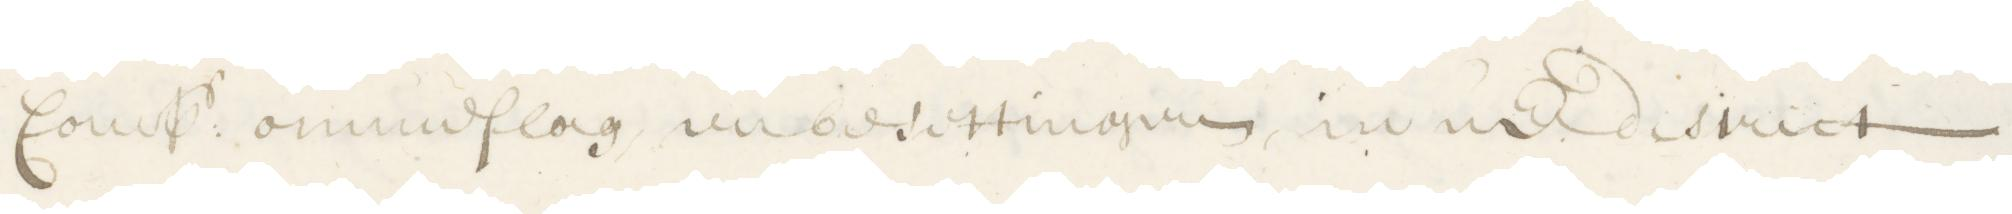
Comp:s ommeslag, en besettingen, in uE district
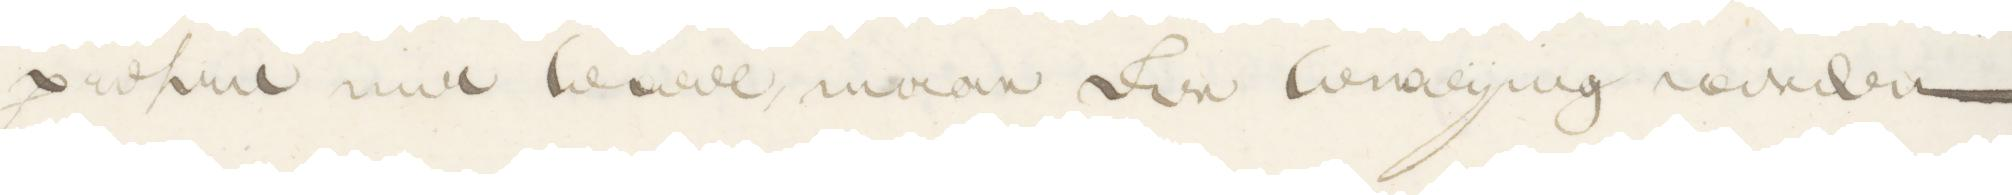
present niet te veel, maar eer teweijnig werden
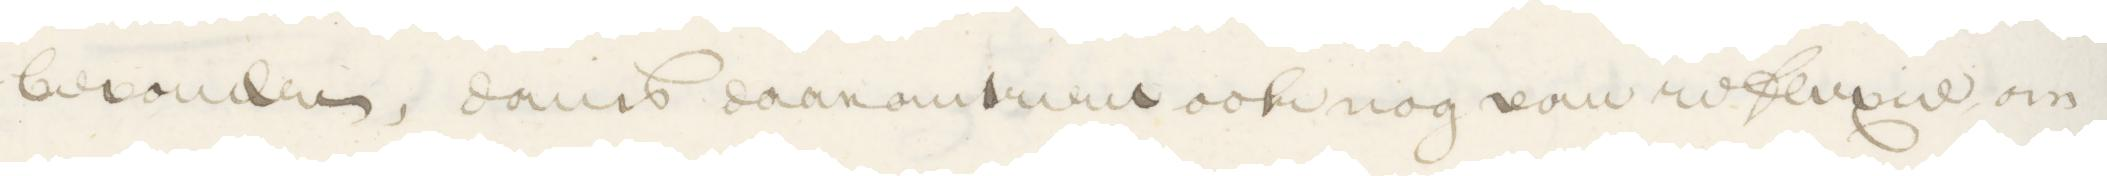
bevonden, danis daaromtrent ook nog van reflexie om
